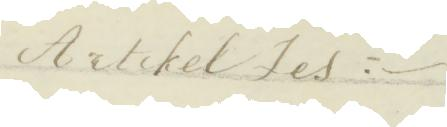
Artikel Zes = -
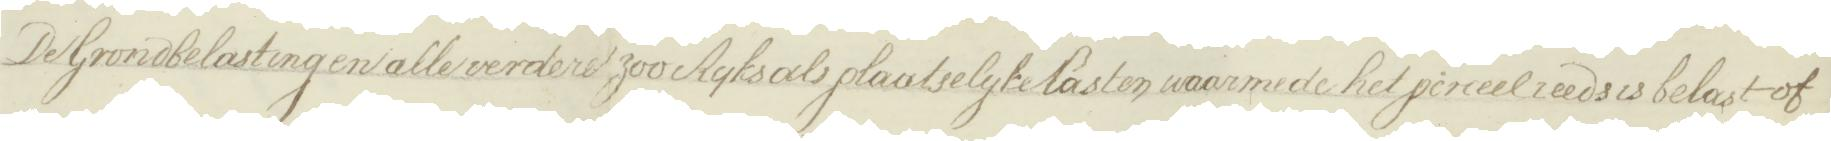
De Grondbelasting en alle verdere zoo Ryks als plaatselyke lasten waarmede het perceel reeds is belast of
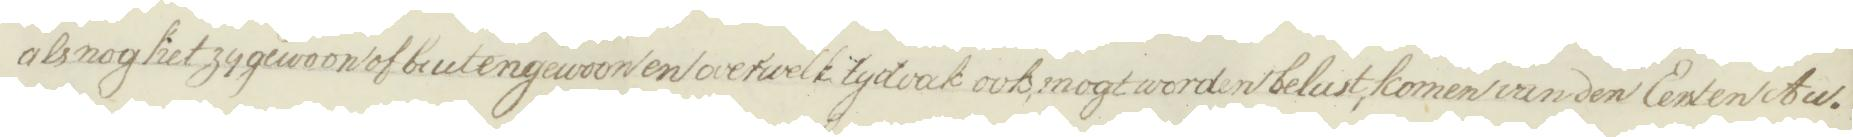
als nog het zy gewoon of buitengewoon en over welk tydvak ook mogt worden belast, komen van den Eersten Au„
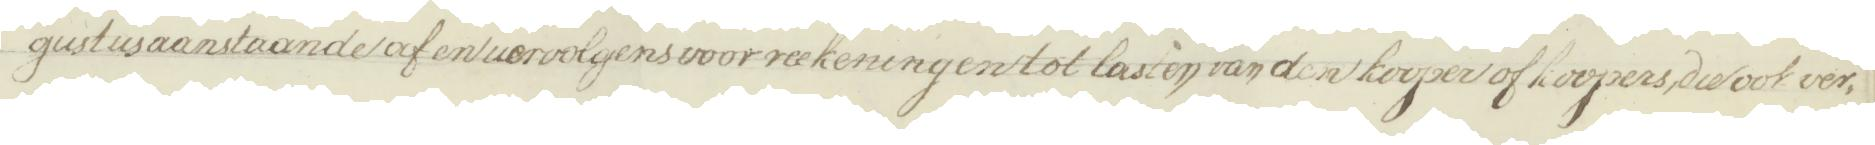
gustus aanstaande af en vervolgens voor reekening en tot lasten van den kooper of koopers, die ook ver„
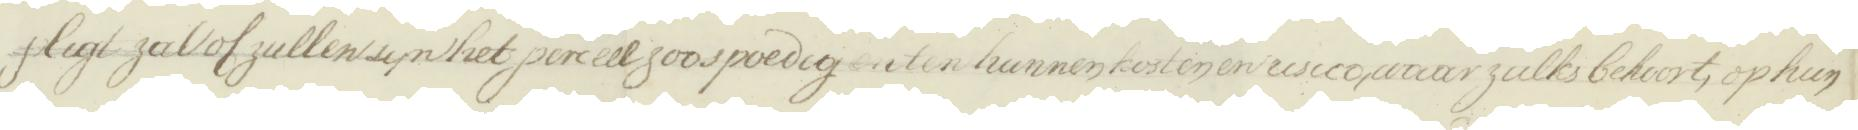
pligt zal of zullen zyn het perceel zoo spoedig en ten hunnen kosten en risico, waar zulks behoort, op hun
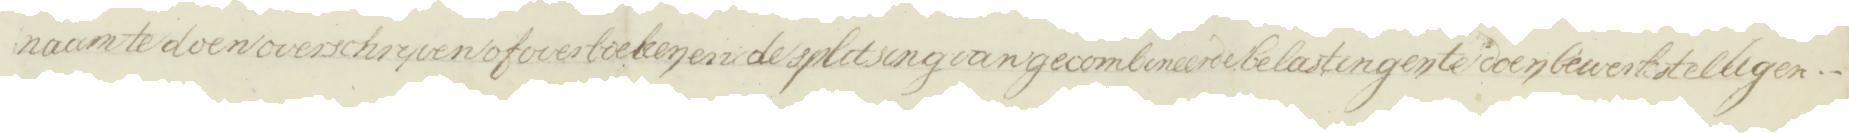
naam te doen overschryven of overboeken en de splitsing van gecombineerde belastingen te doen bewerkstelligen.-
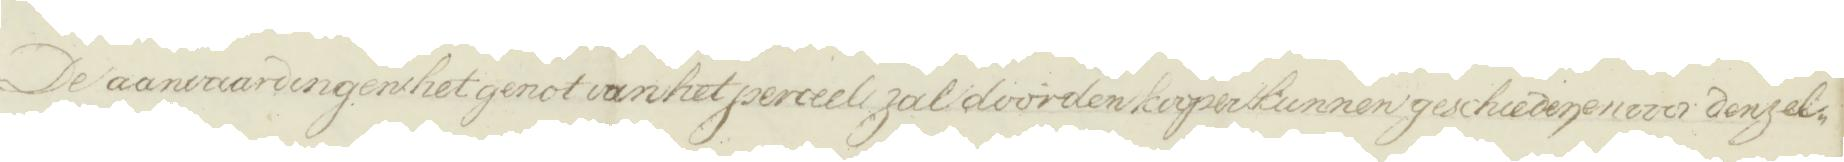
De aanvaarding en het genot van het perceel zal door den kooper kunnen geschieden en over den zel„
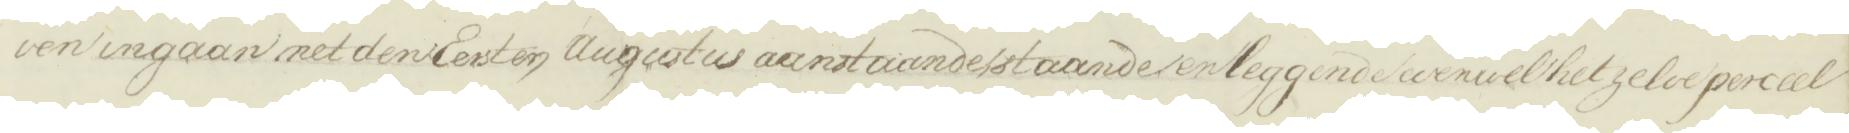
ven ingaan met den Eersten Augustus aanstaande staande en leggende evenwel het zelve perceel
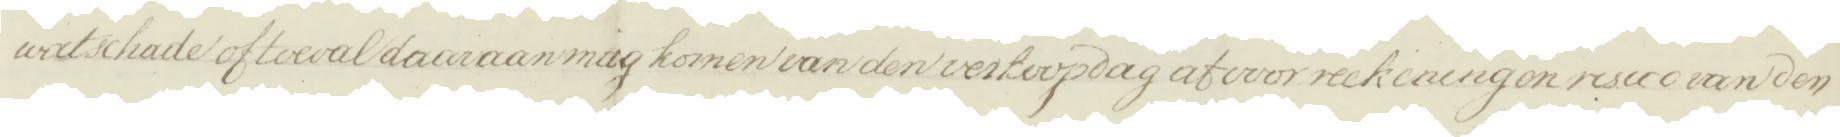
wat schade of toeval daar aan mag komen van den verkoopdag af voor reekening en risico van den
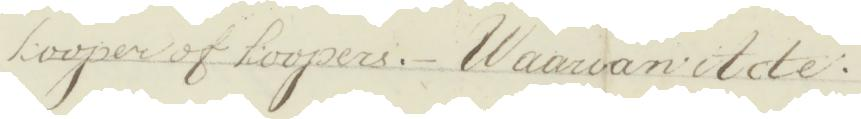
kooper of koopers.- Waarvan Acte:
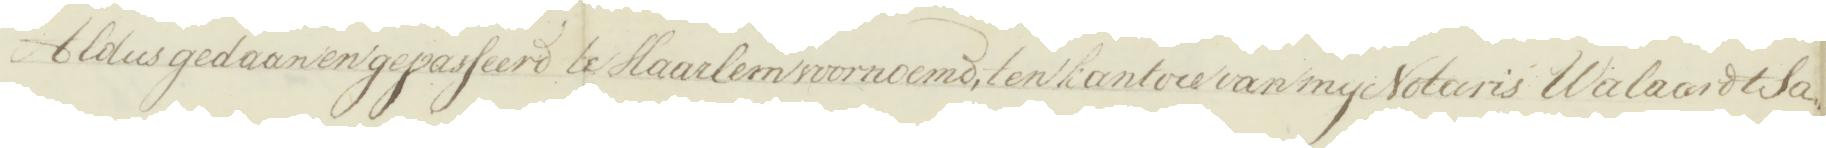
Aldus gedaan en gepasseerd te Haarlem voornoemd, ten kantore van my Notaris Walaardt Sa„
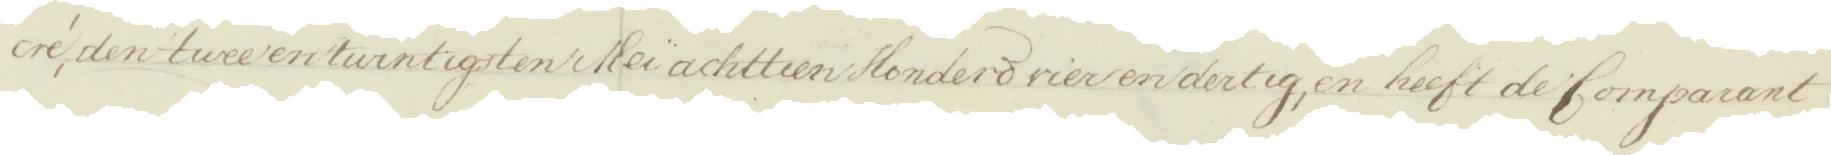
cré, den twee en twintigsten Mei achttien Honderd vier en dertig, en heeft de Comparant
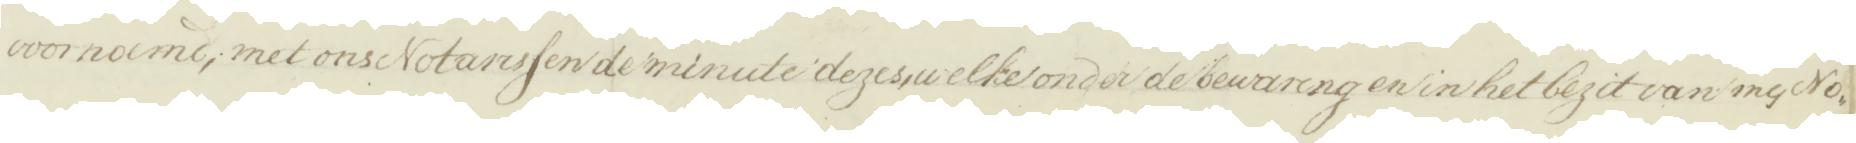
voornoemd, met ons Notarissen de minute dezes, welke onder de bewaring en in het bezit van my No„
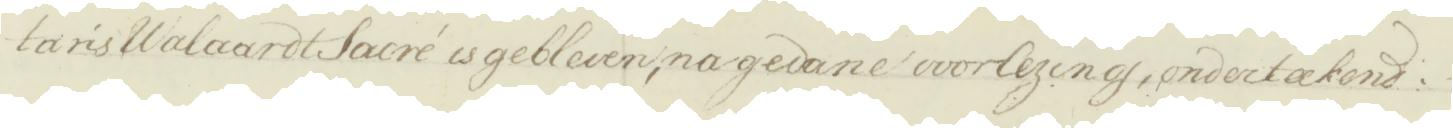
taris Walaardt Sacré is gebleven, na gedane voorlezing, onderteekend:
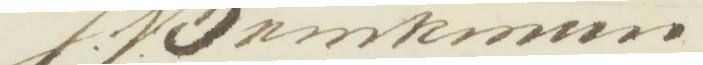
J. Brinkman
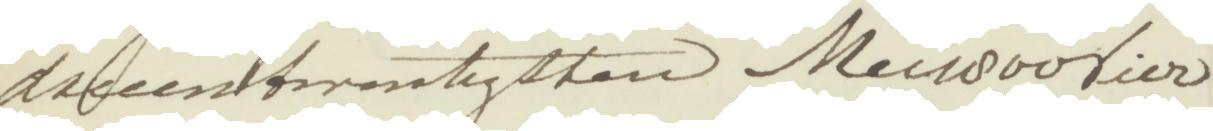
drie entwintigsten Mei 1800 vier
